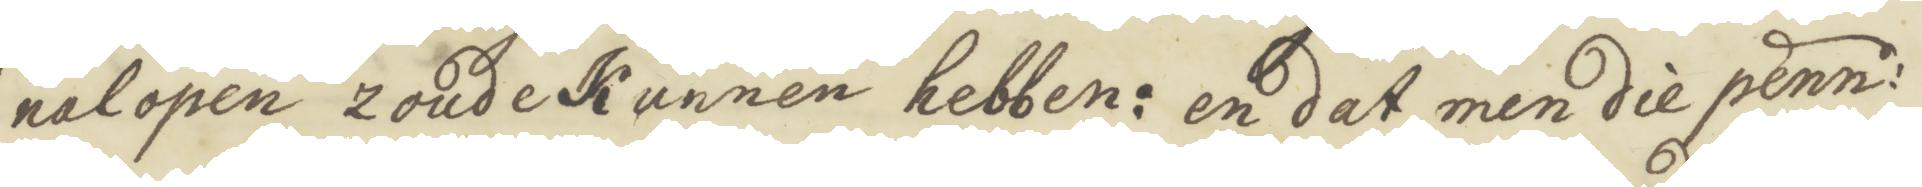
nalopen zoude kunnen hebben: en dat men die penn:
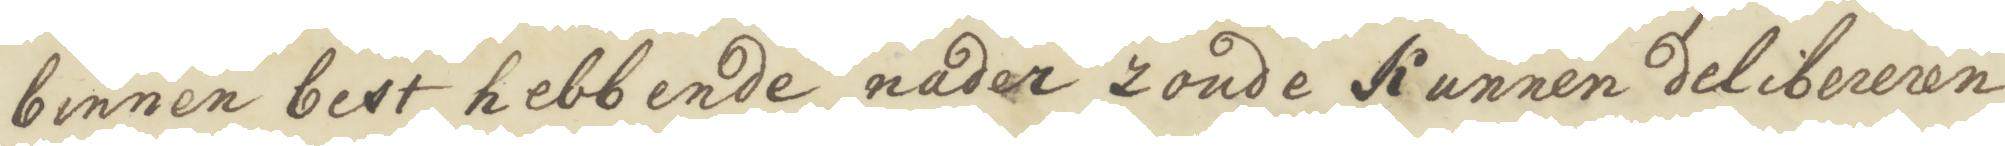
binnen best hebbende nader zoude kunnen delibereren
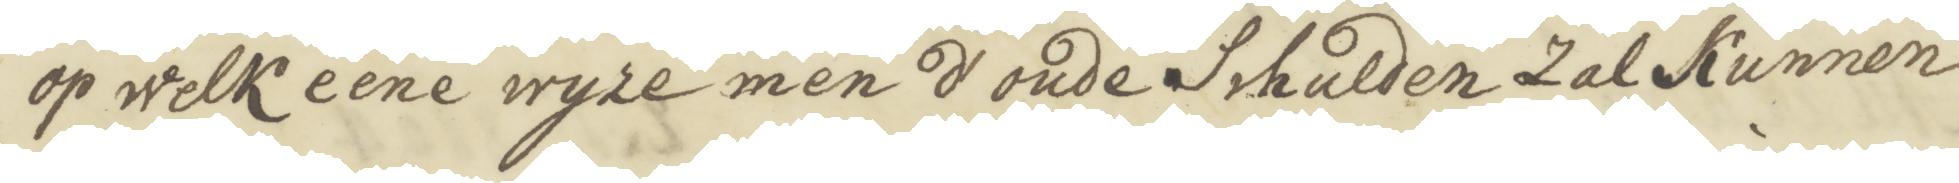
op welk eene wyze men d'oude schulden zal kunnen
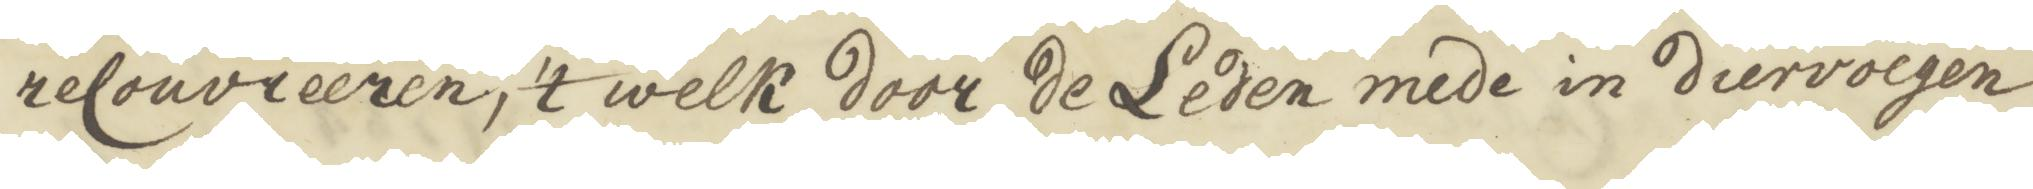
recouvreeren, 't welk door de Leden mede in diervoegen
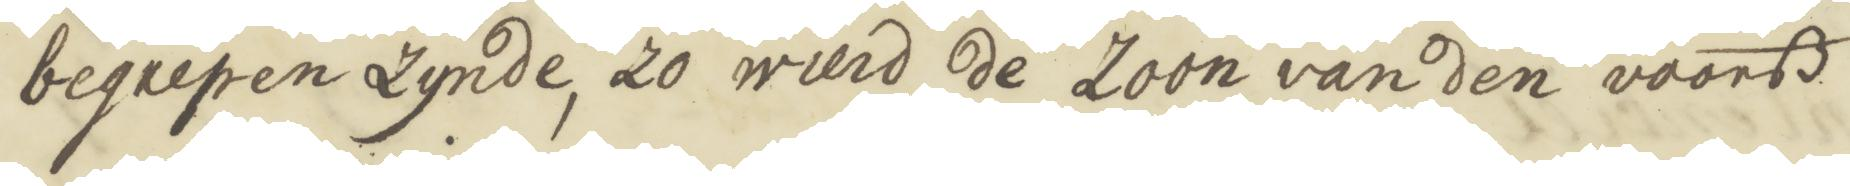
begrepen zynde, zo wierd de zoon van den voorsz
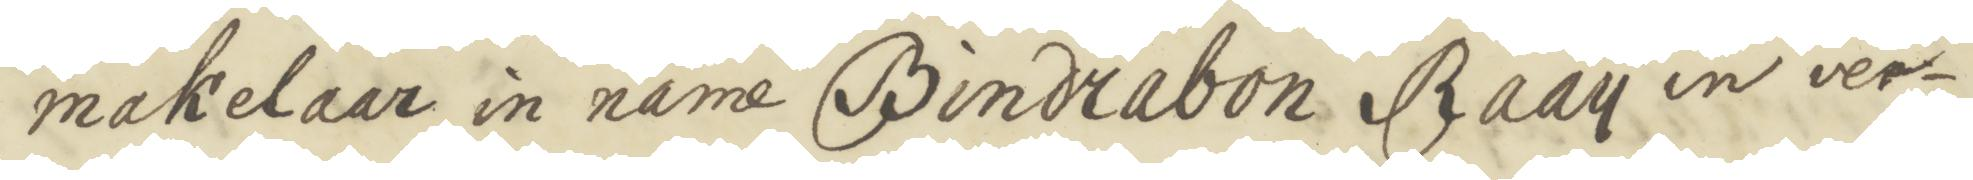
makelaar in name Bindrabon Raaij in ver-
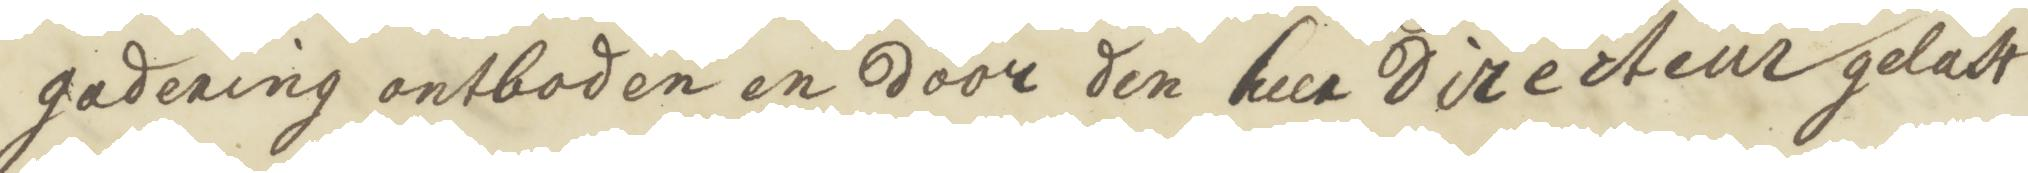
gadering ontboden en door den heer directeur gelast
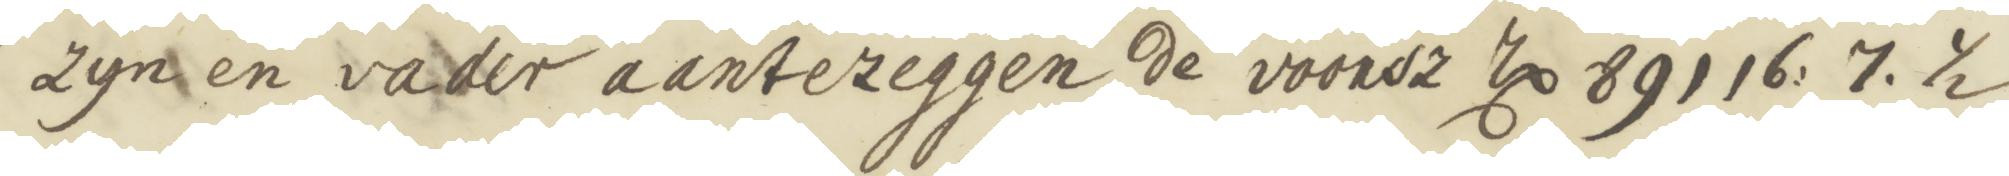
zyn en vader aantezeggen de voorsz Rx 89116: 7. ½
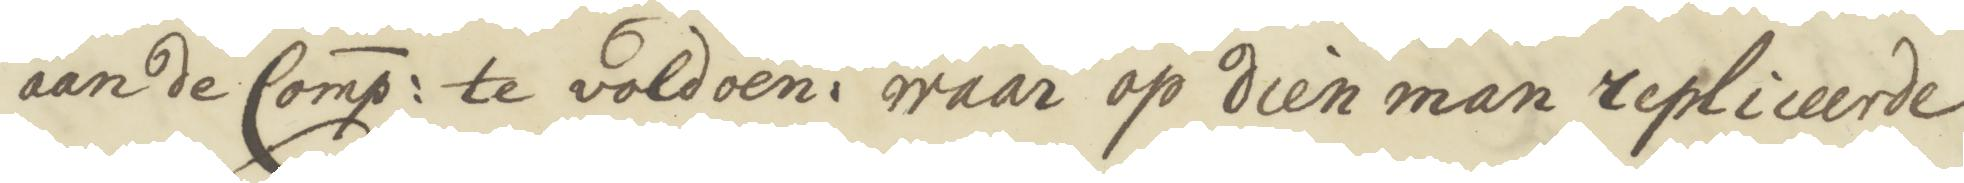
aan de Comp: te voldoen: waar op dien man repliceerde
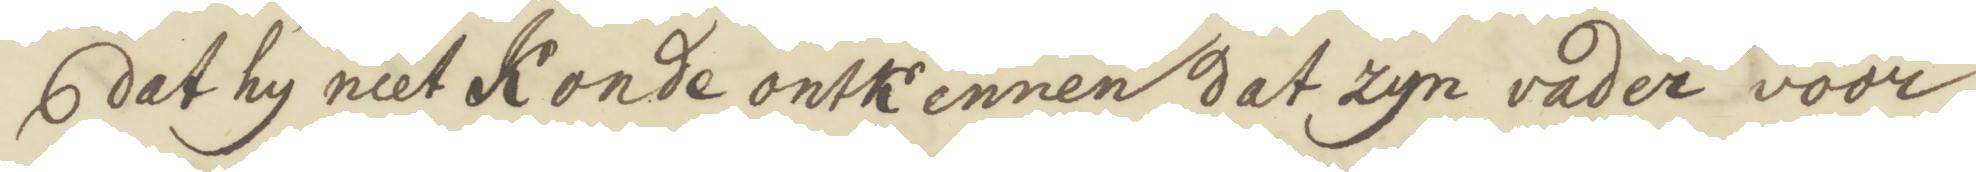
dat hy niet konde ontkennen dat zyn vader voor
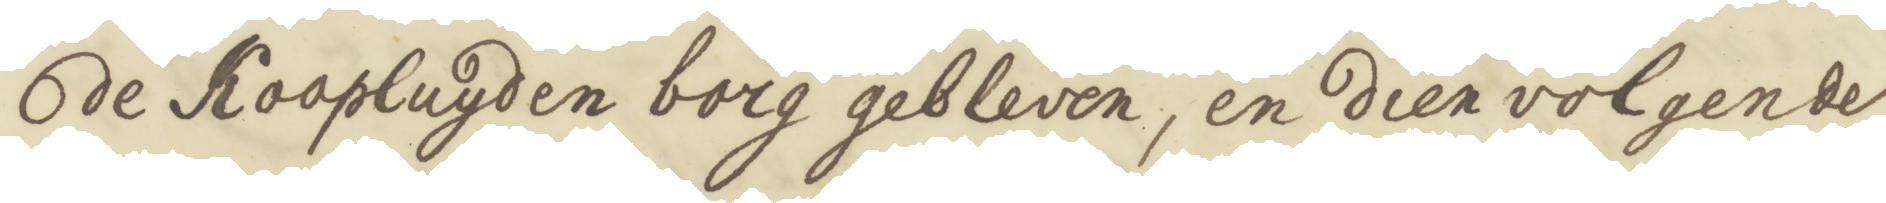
de koopluyden borg gebleven, en dier volgende
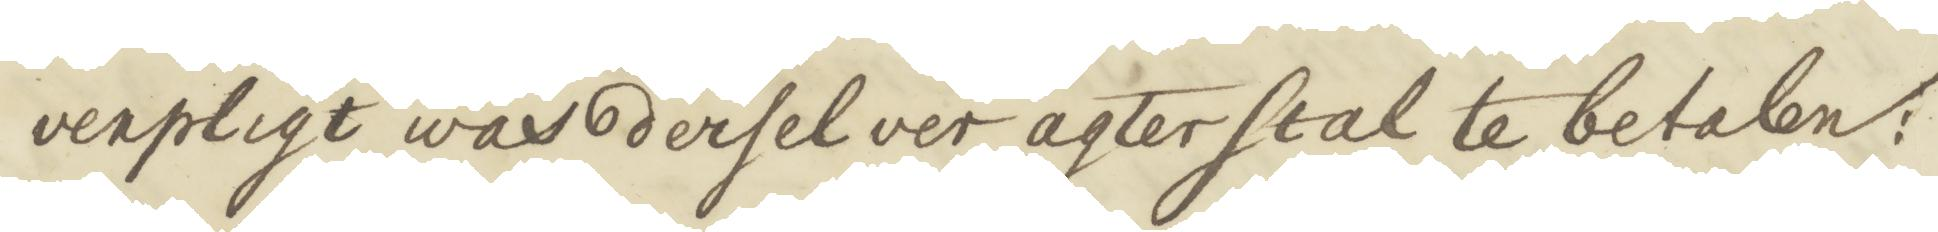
verpligt was derselver agterstal te betalen:
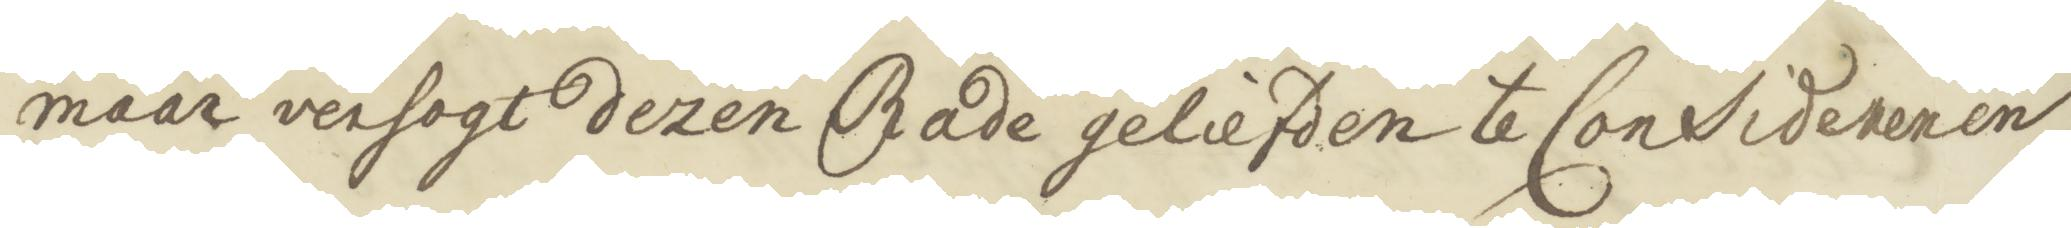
maar versogt dezen Rade geliefden te Considereren
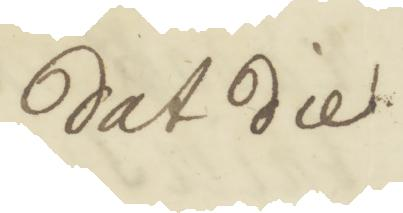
dat die
